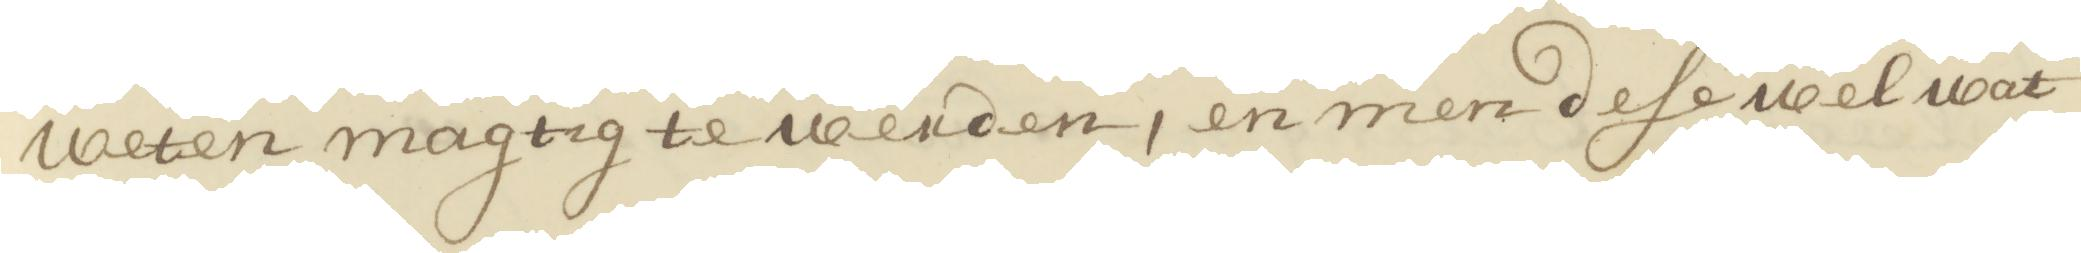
weten magtig te werden, en men dese wel wat
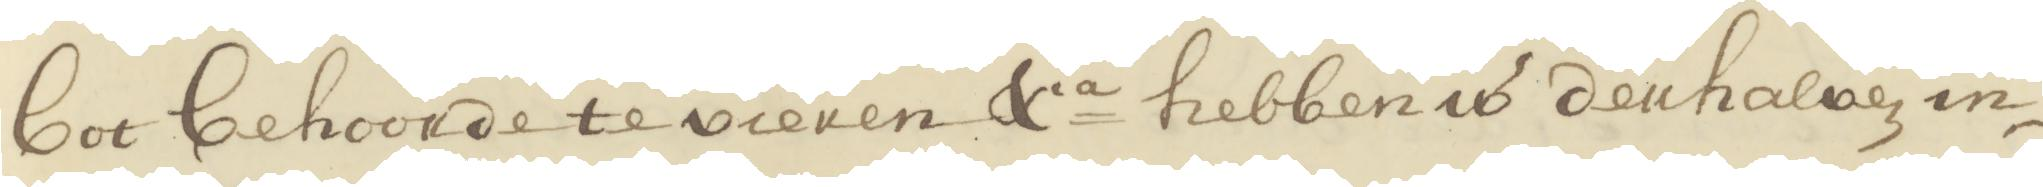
bot behoorde te vieren &='a hebben w' derhalven in
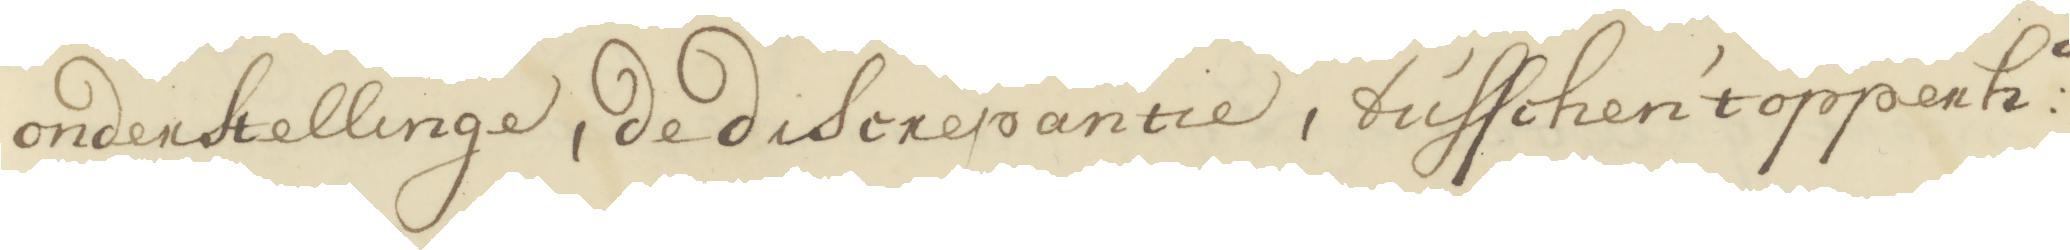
onderstellinge, de discrepantie, tusschen ’t opperh:d
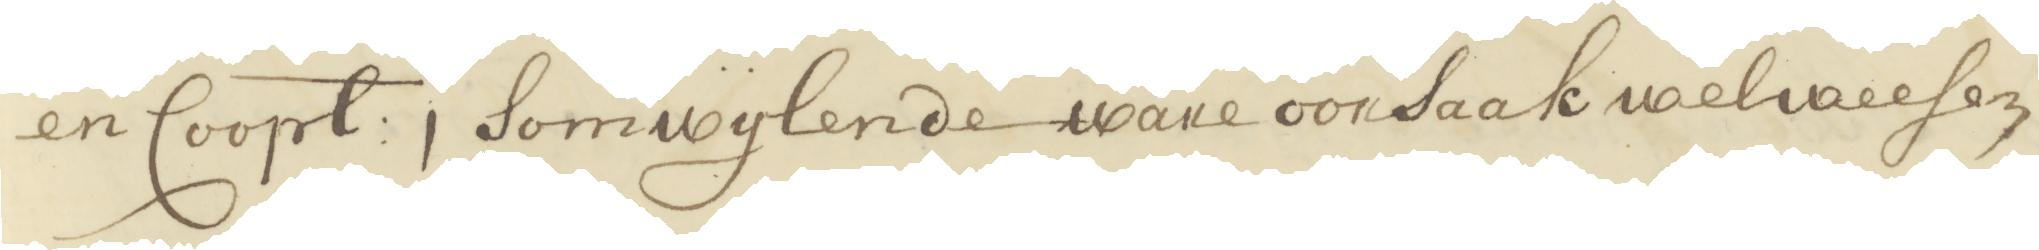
en Coopl: , Somwijlende ware oorsaak wel weesen
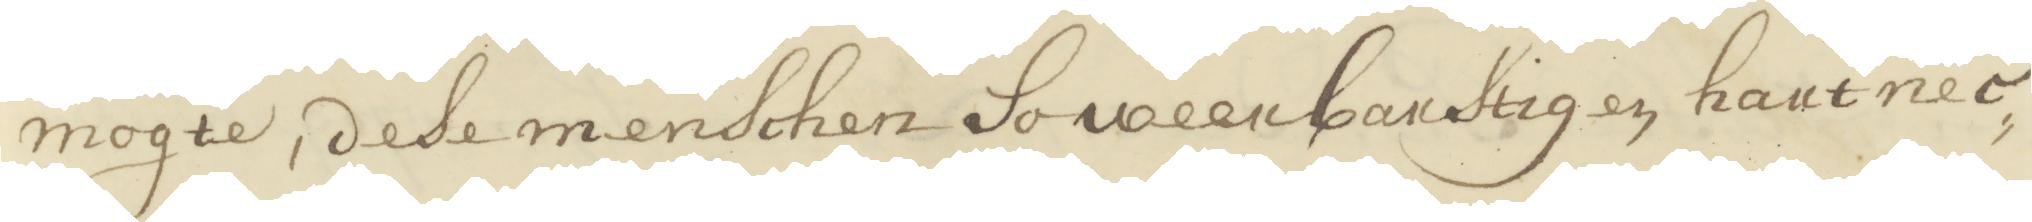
mogte, dese menschen So weerbarstig en hart nec„
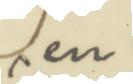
^en
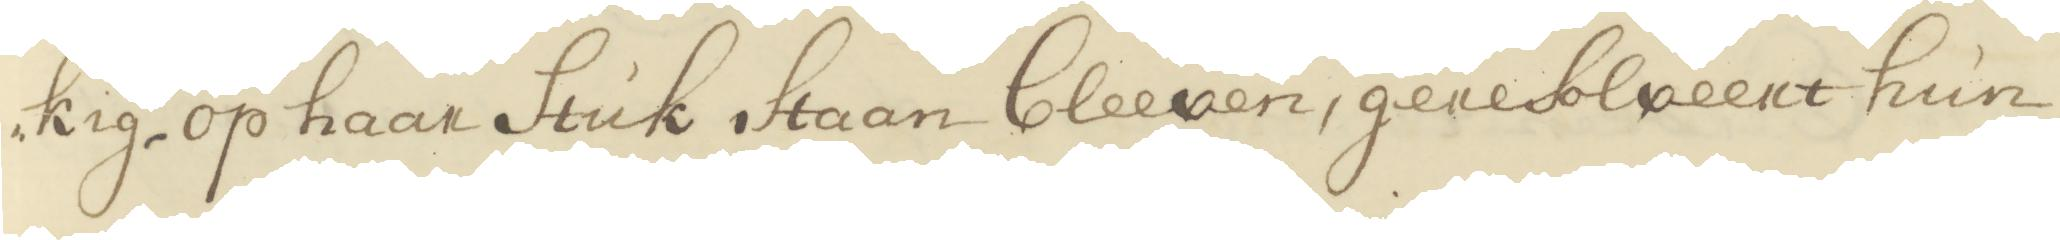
„kig, op haar Stuk Staan bleeven, geresolveert hun
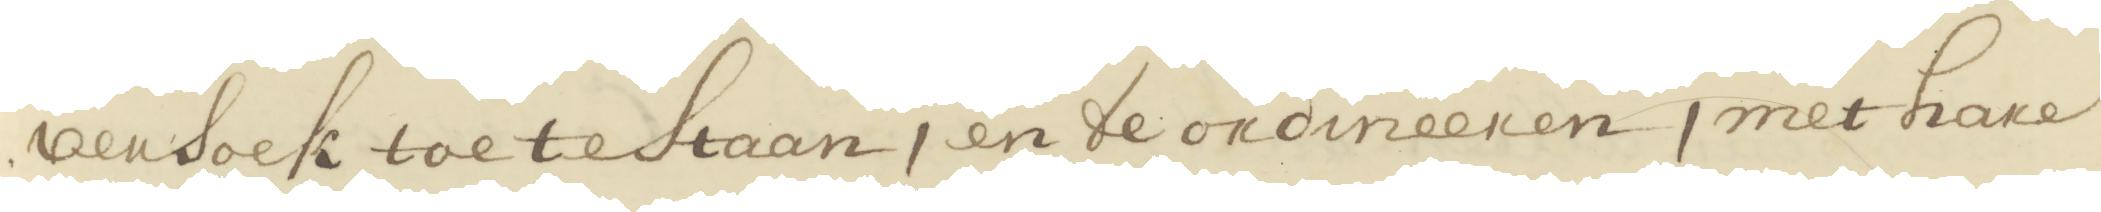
versoek toe te Staan, en te ordineeren; met hare
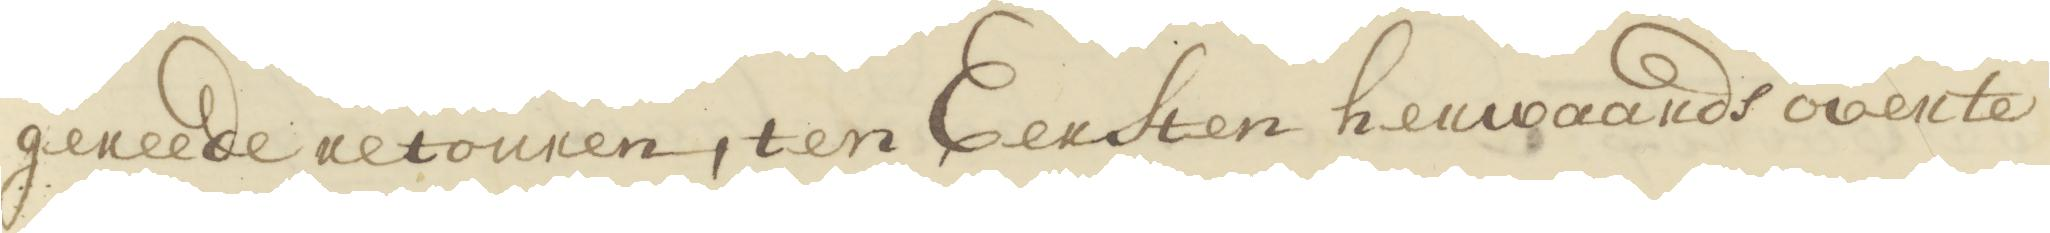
gereede retouren, ten Eersten herwaards over te
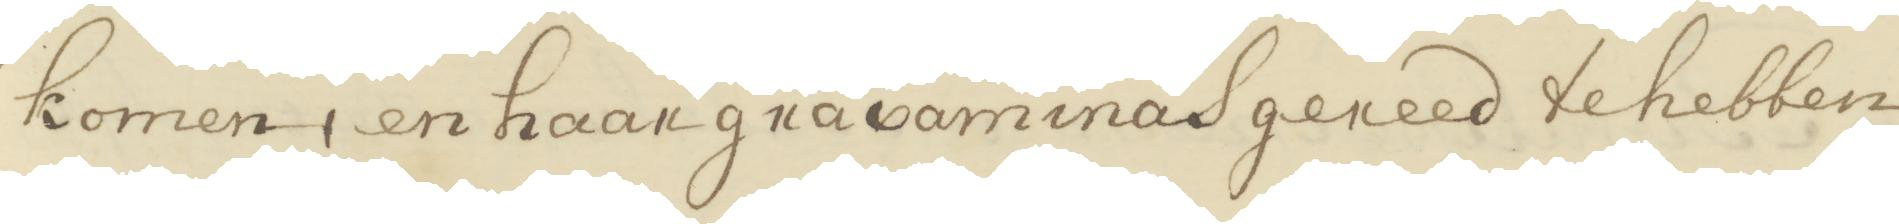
komen, en haar gravaminas gereed te hebben
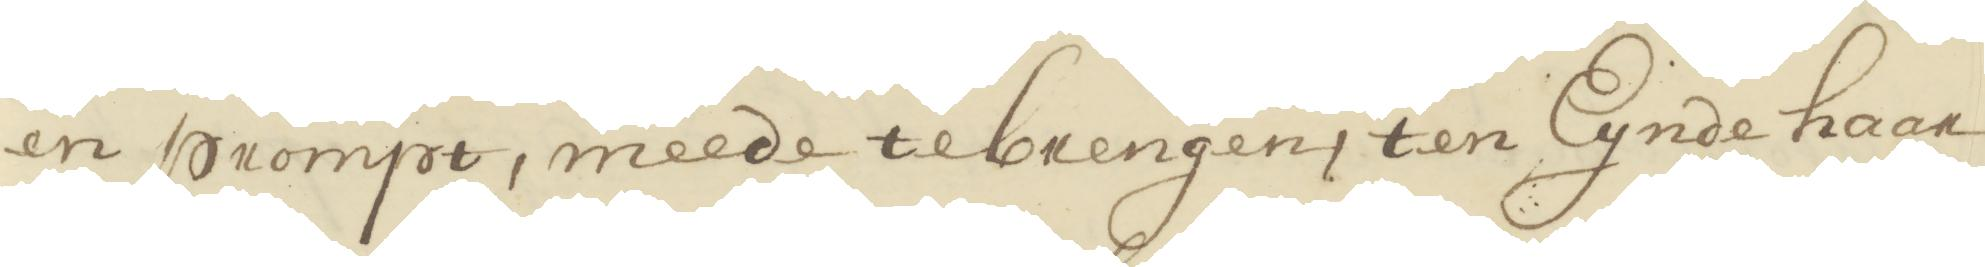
en prompt, meede te brengen, ten Eijnde haar
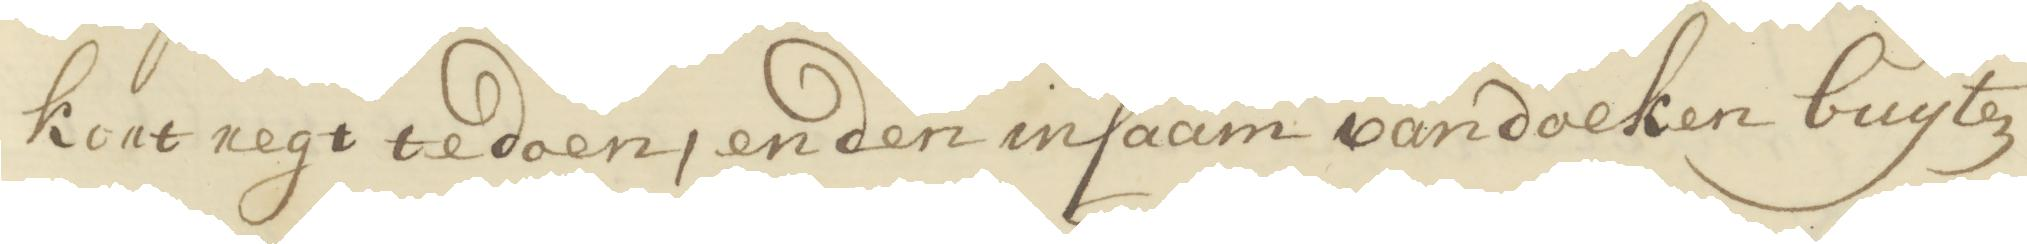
kort regt te doen, en den insaam van doeken buijten
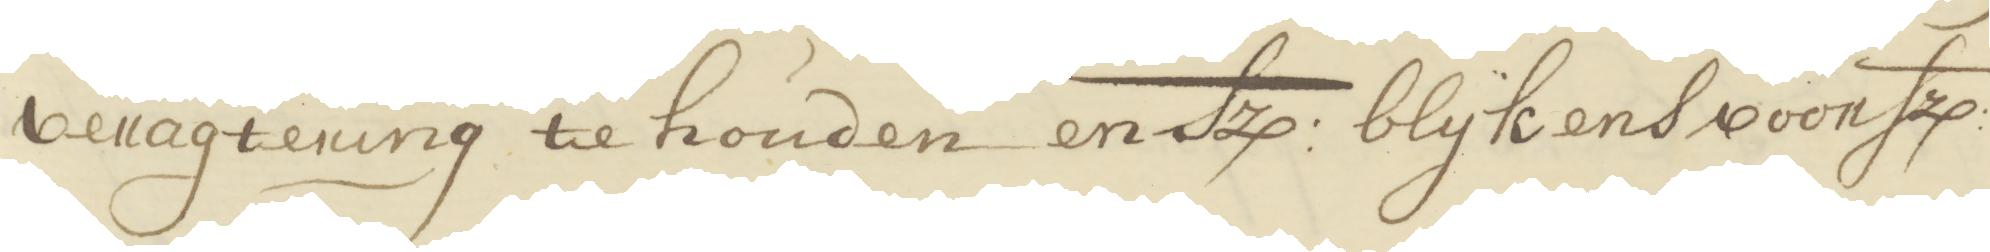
veragtering te houden en Sz: blijkens voor Sz:
